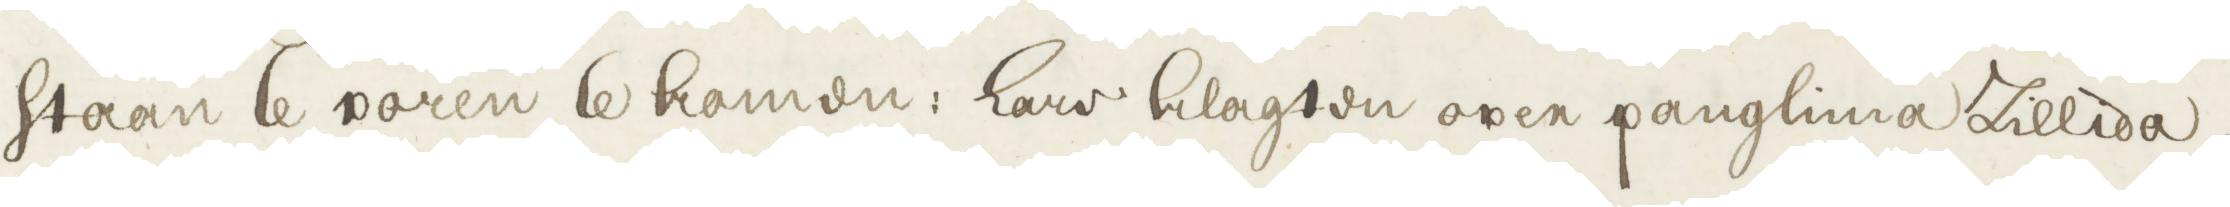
staan te voren te komen: hare klagten over panglima zillida,
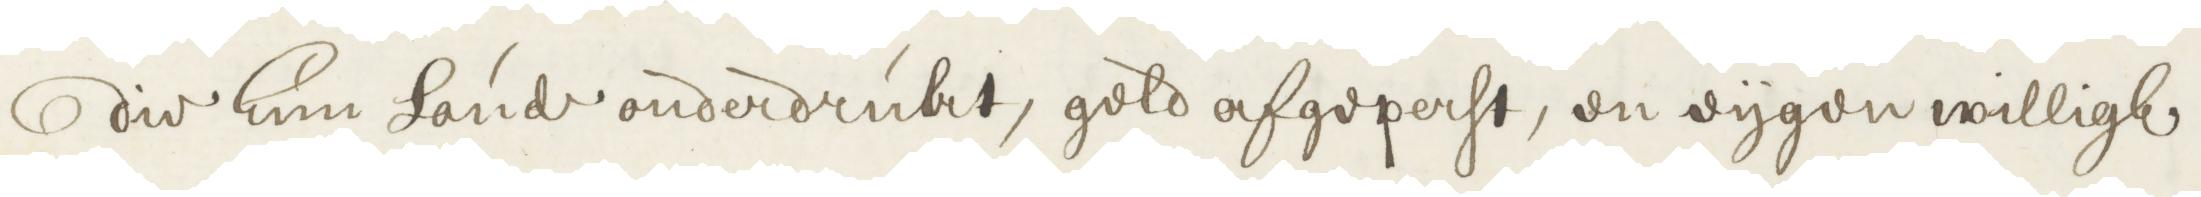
die hun soude onderdrukt, geld afgeperst, en eijgen willigh
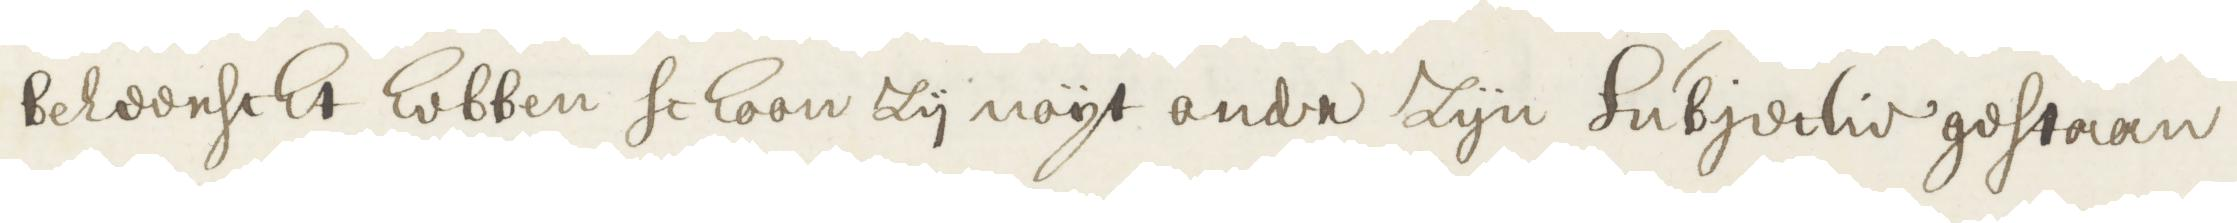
beheerscht hebben schoon zij noijt onder zijn subjectie gestaan
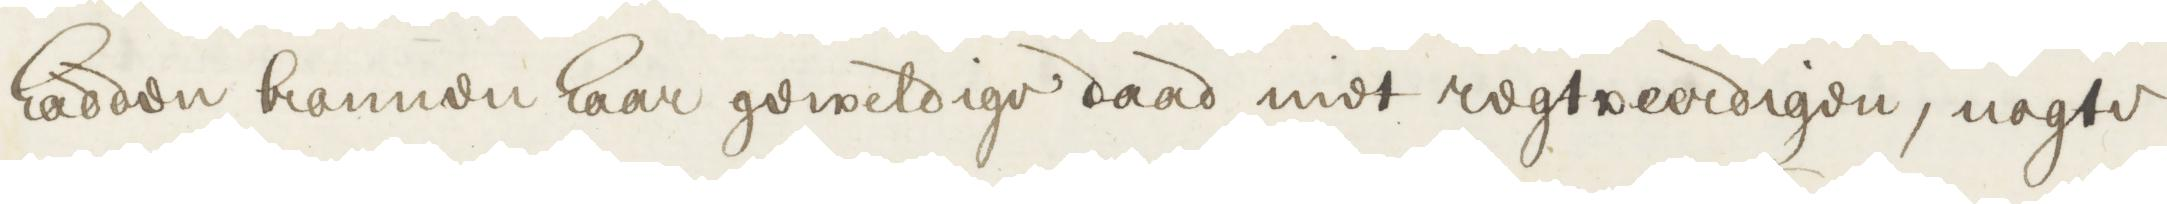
hadden konnen haar geweldige daad niet regtveerdigen, nogte
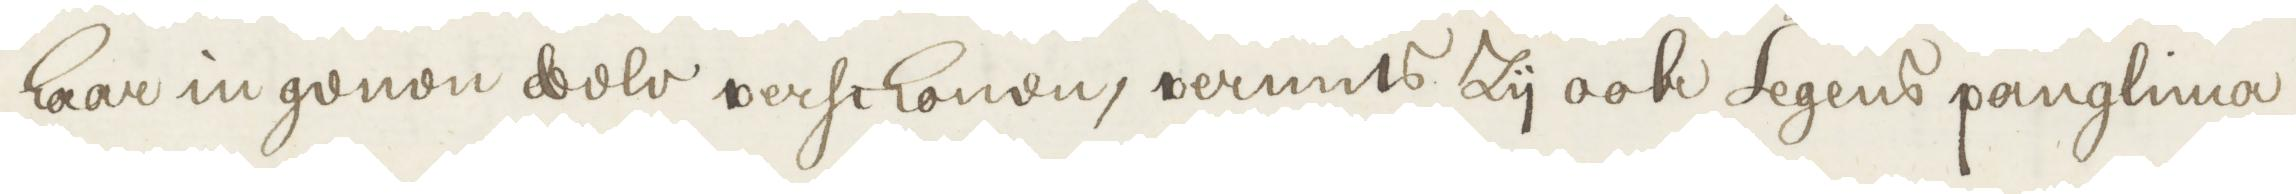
haar in genen deele verschonen, vermits zij ook tegens panglima
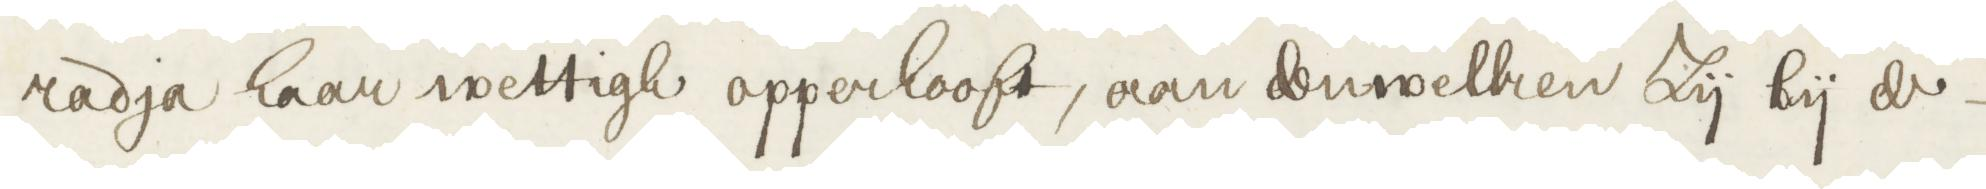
radja haar wettigh opperhooft, aan denwelken zij bij de
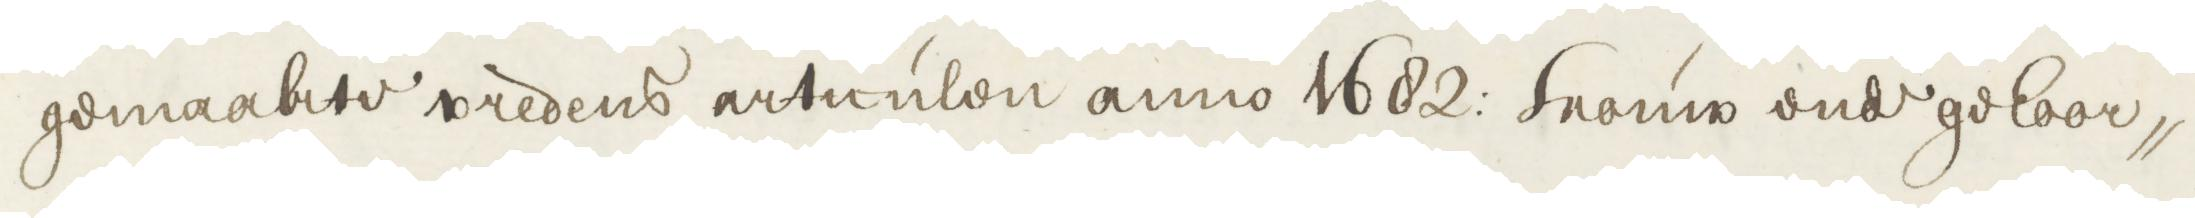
gemaakte vredens articulen anno 1682: trouw ende gehoor„
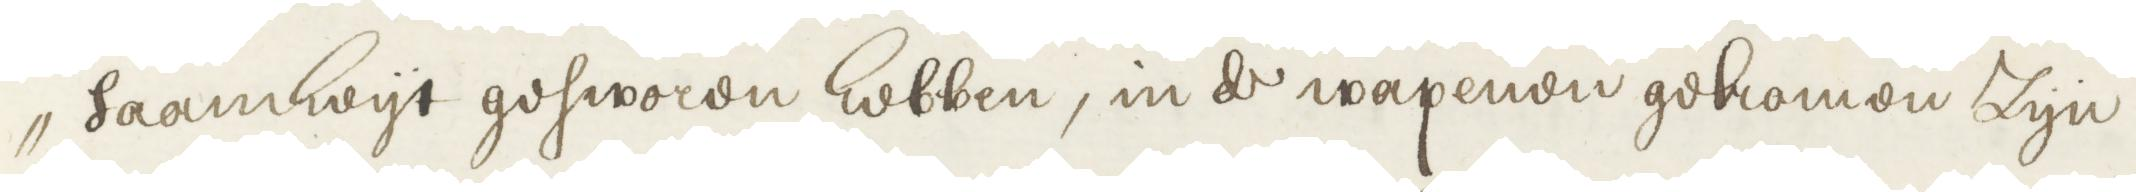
„saamkeijt gesworen hebben, in de wapenen gekomen zijn
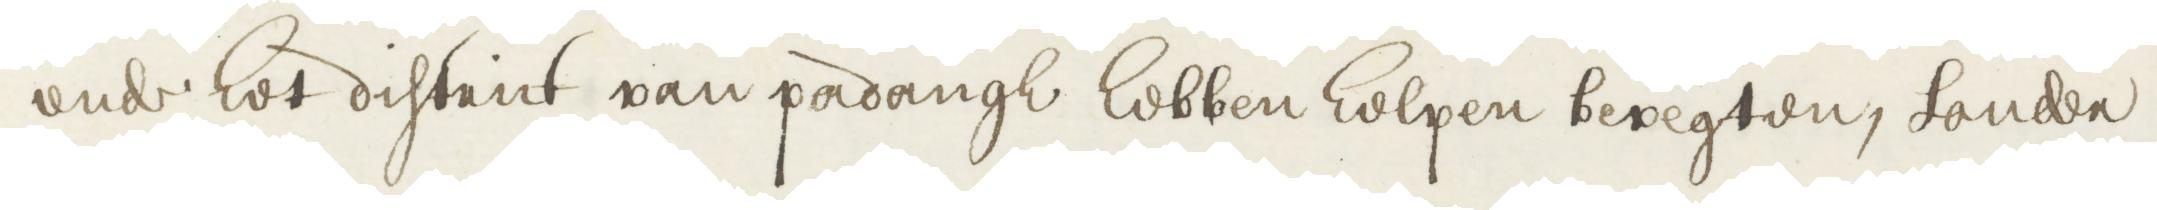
ende het district van padangh hebben helpen bevegten, sonder
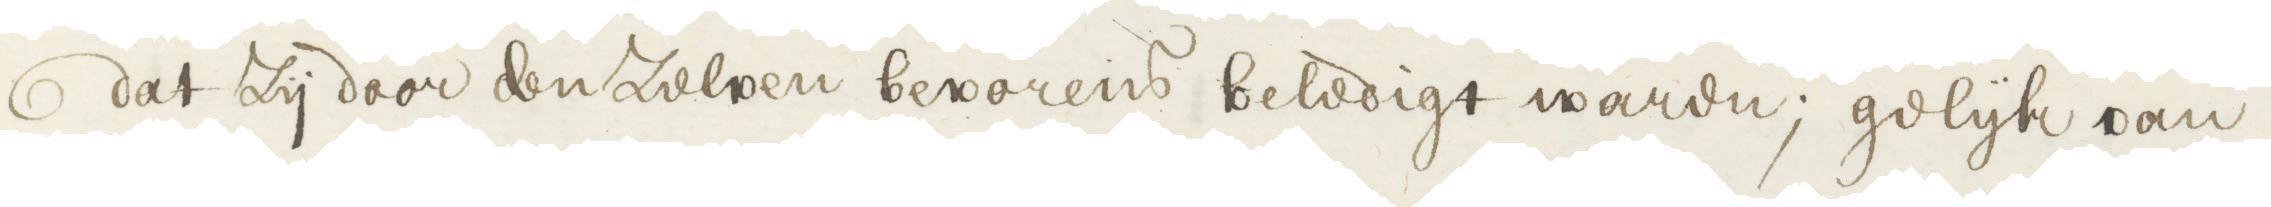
dat zij door den zelven bevorens beledigt waren; gelijk van
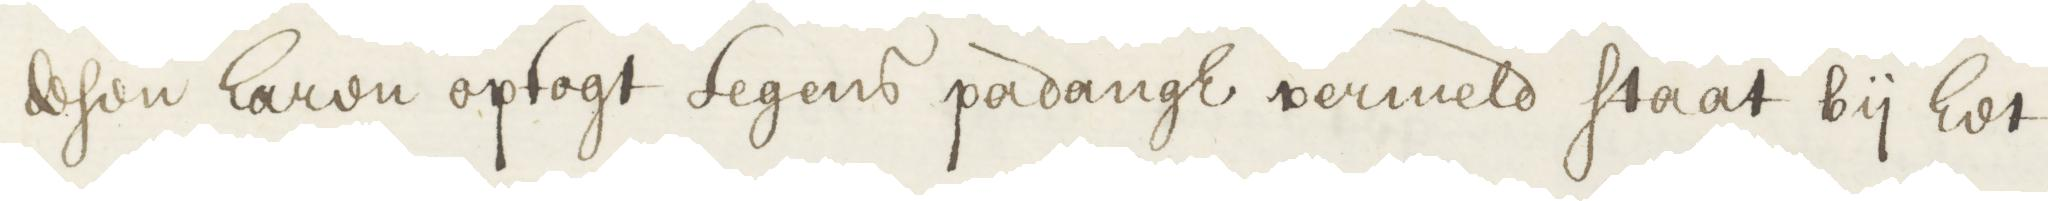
desen haren optogt tegens padangh vermeld staat bij het
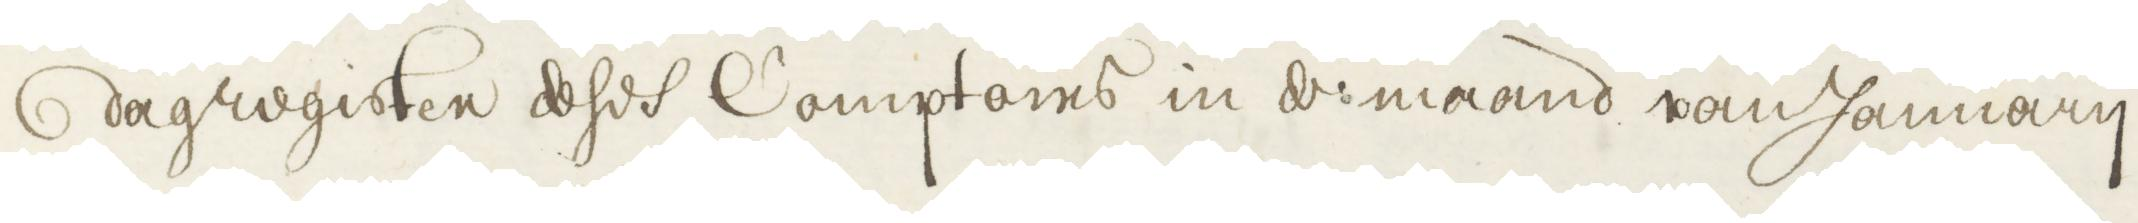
dagregister deses Comptoirs in de maand van Januarij
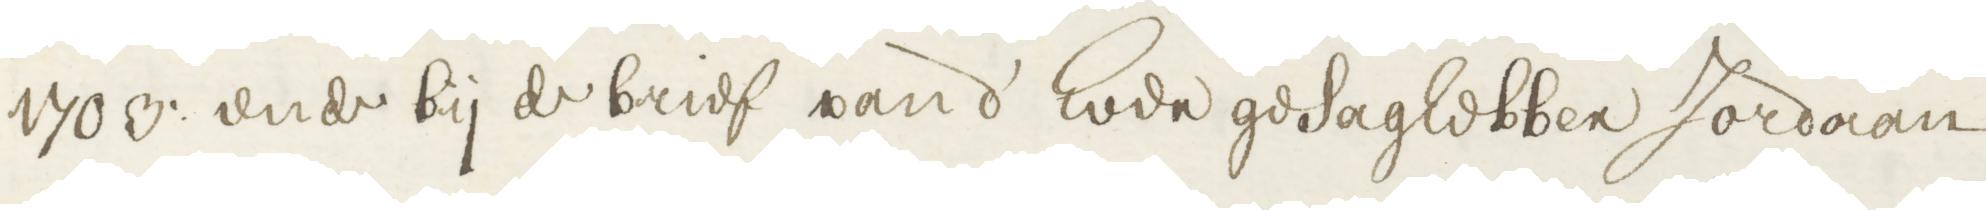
1703: ende bij de brief van d’ Heer gesaghebber Jordaan
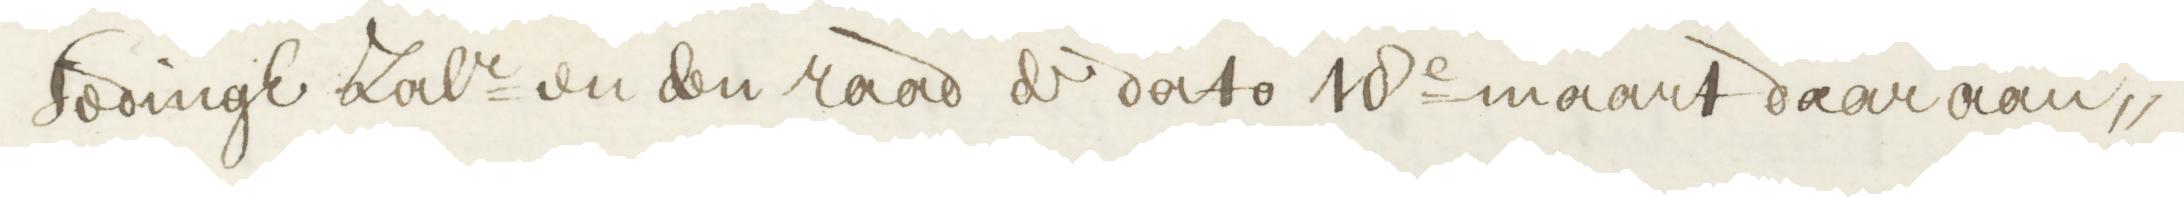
tedingh zal=r en den raad de dato 18=e maart daar aan„
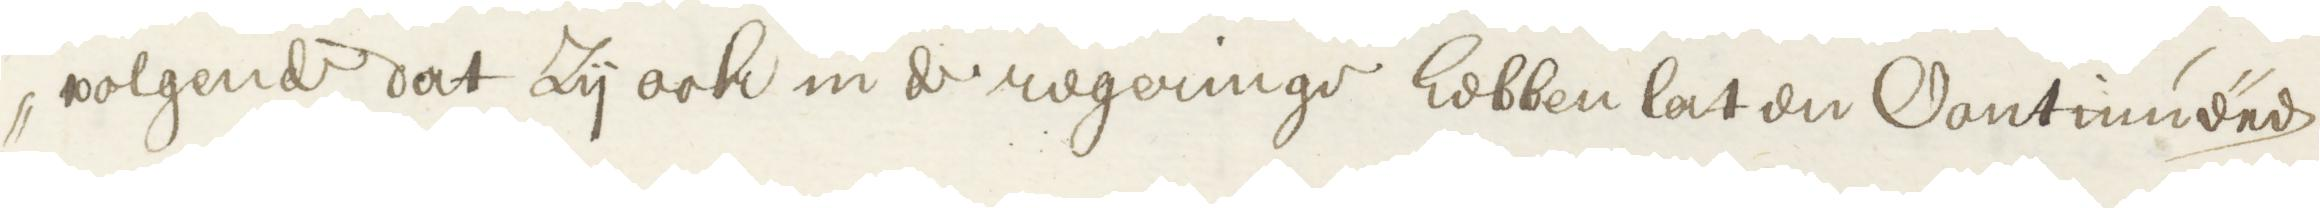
„volgende dat zij ook in de regeringe hebben laten Continueren
